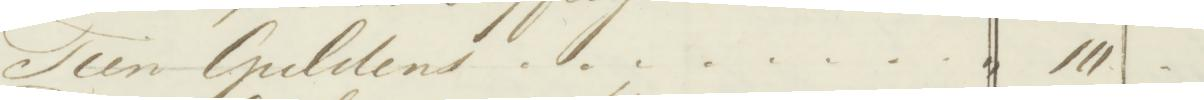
Tien Guldens . . . . . . . . „ 10 —
